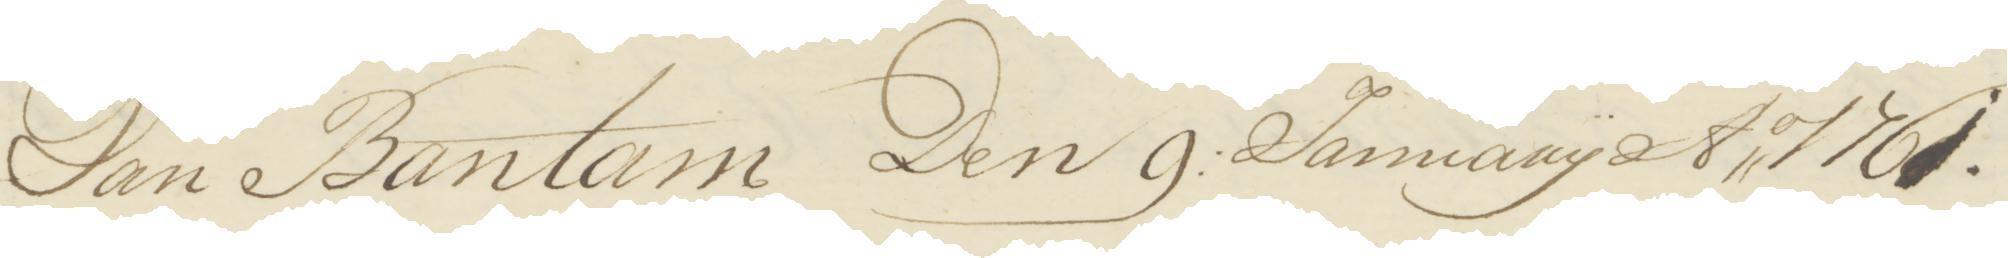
Van Bantam Den 9: Januarij A„o 1761.
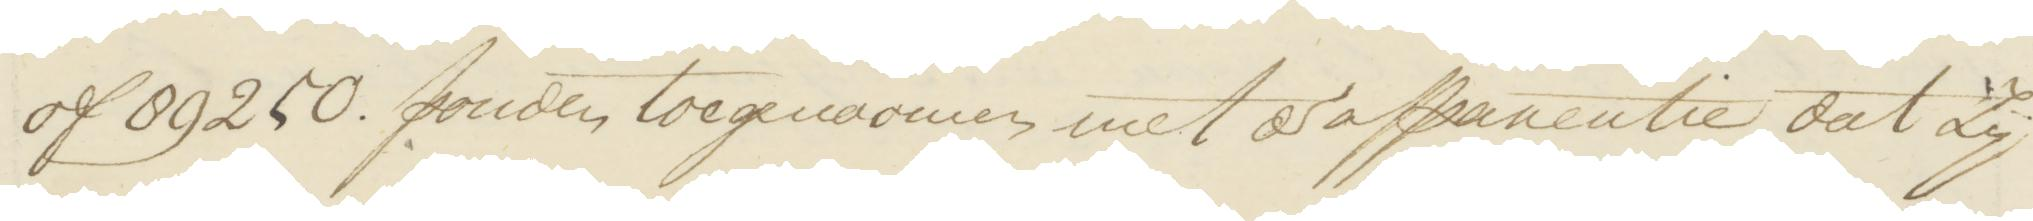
of 89250. ponden toegenoomen met de apparentie dat zij
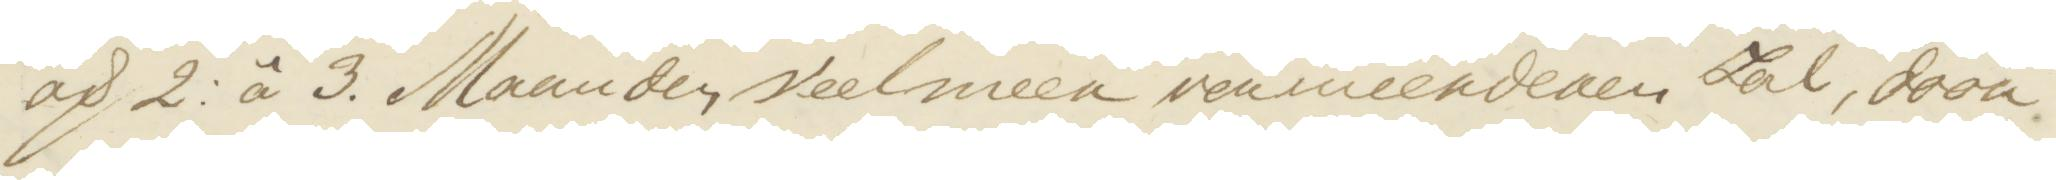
over 2: â 3. Maanden veel meer vermeerderen zal, door
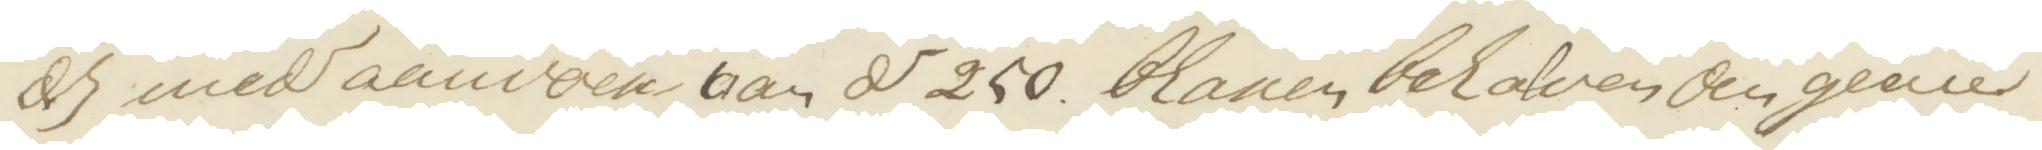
den mede aanvoer van de 250. bharen behalven den geene
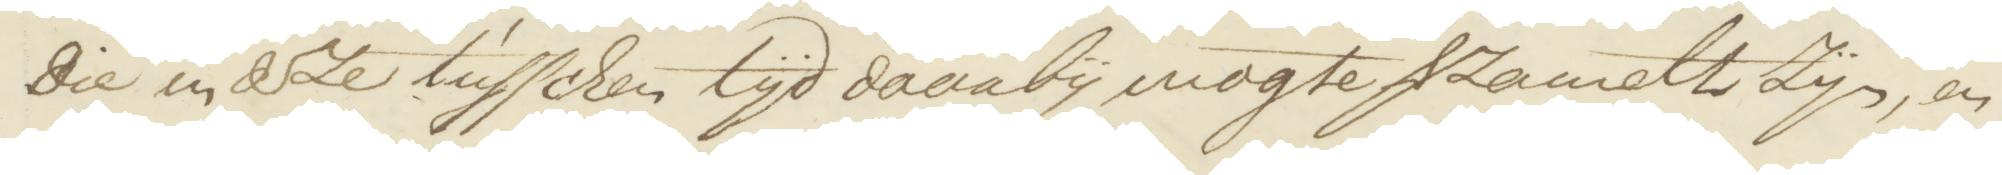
die in deze tusschen tijd daarbij mogte verzamelt zijn, en
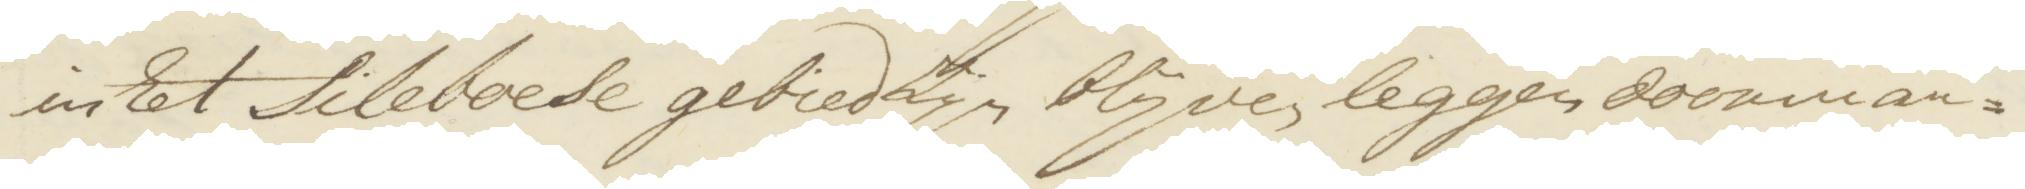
in het sileboese gebied zijn blijven leggen door man=
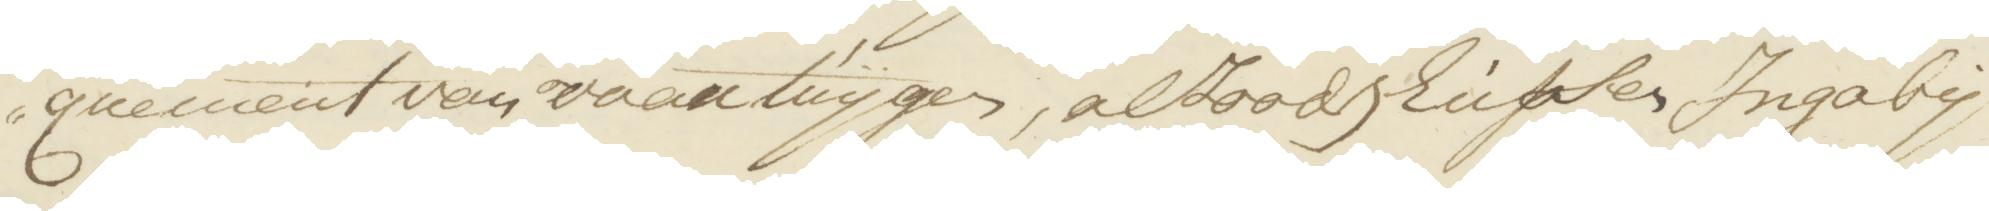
„quement van vaartuijgen, alzoo den hupsen Jngabij
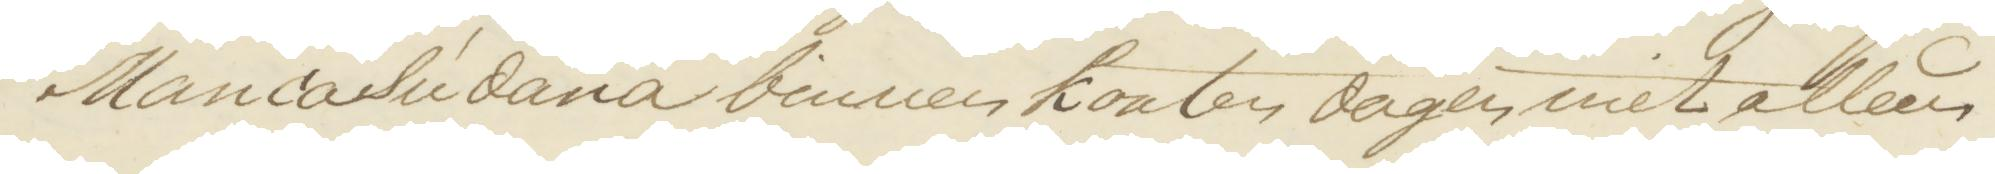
Mancasudana binnen korten dagen niet alleen
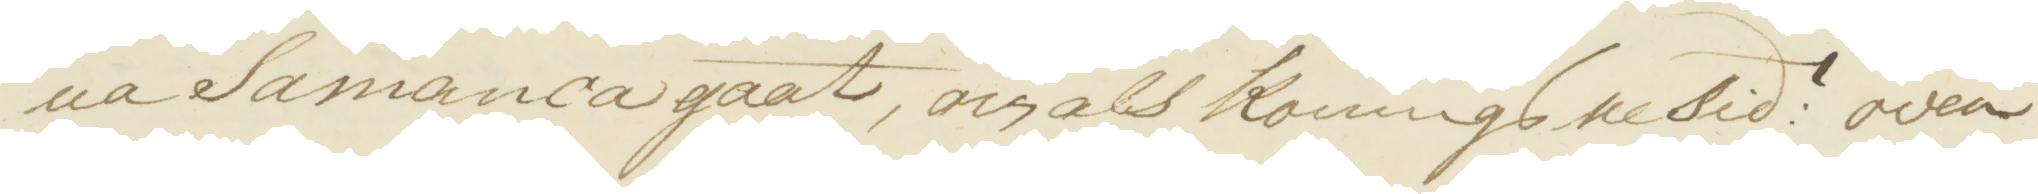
na samanca gaat, om als konings resid:t over
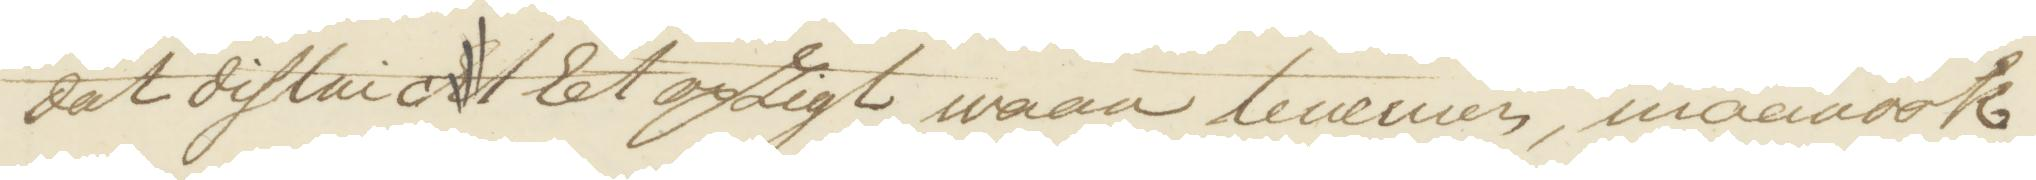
dat districht het opzigt waar tenemen, maar ook
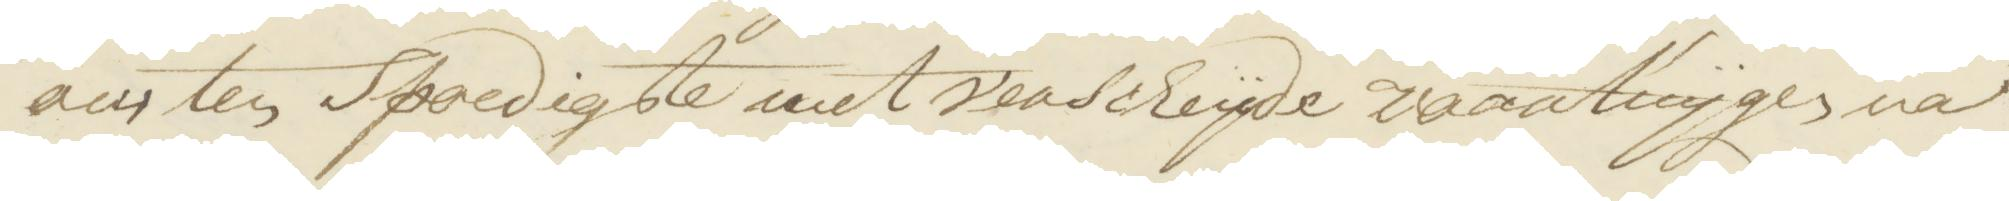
aen ten spoedigste met verscheijde vaartuijgen na
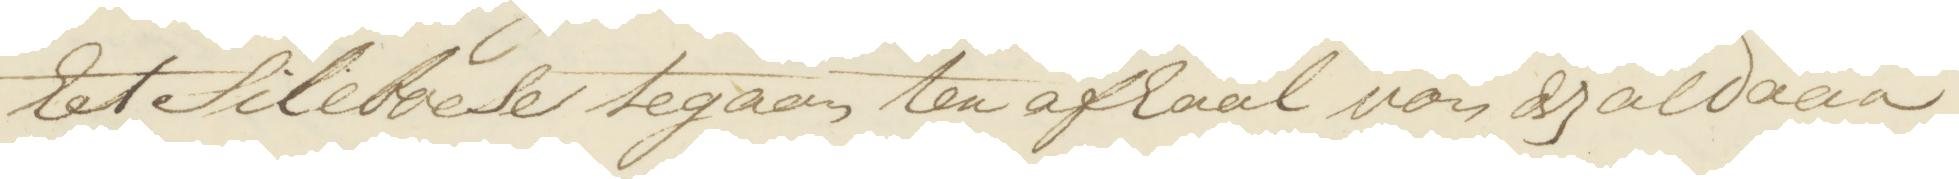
het sileboese te gaan ter afhaal van den aldaar
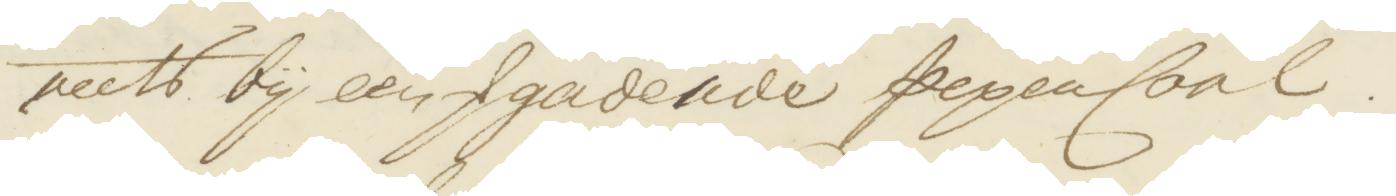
reets bij een vergaderde pepercool.
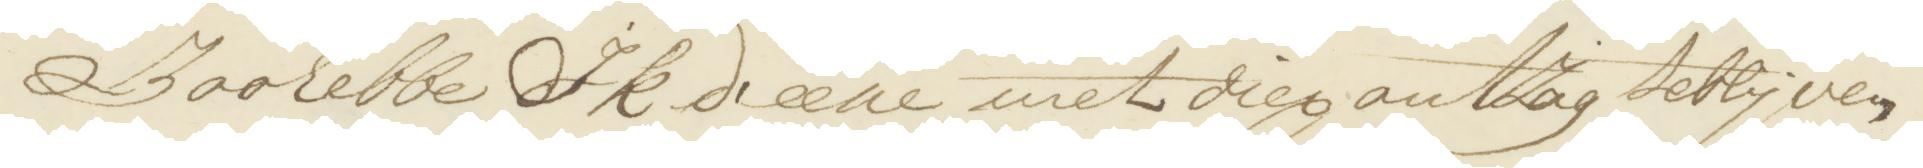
Zoo hebbe Ik d'eere met diep ontzag te blijven
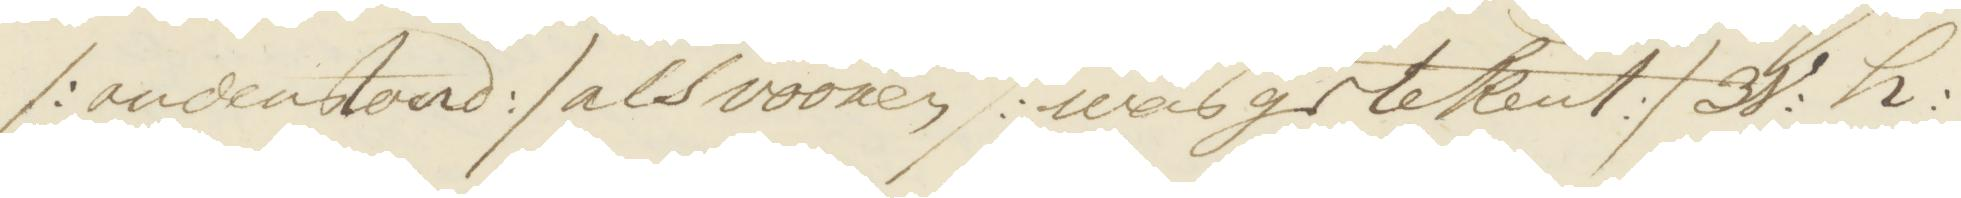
/:onderstond:/ als vooren /:was getekent:/ W: h:
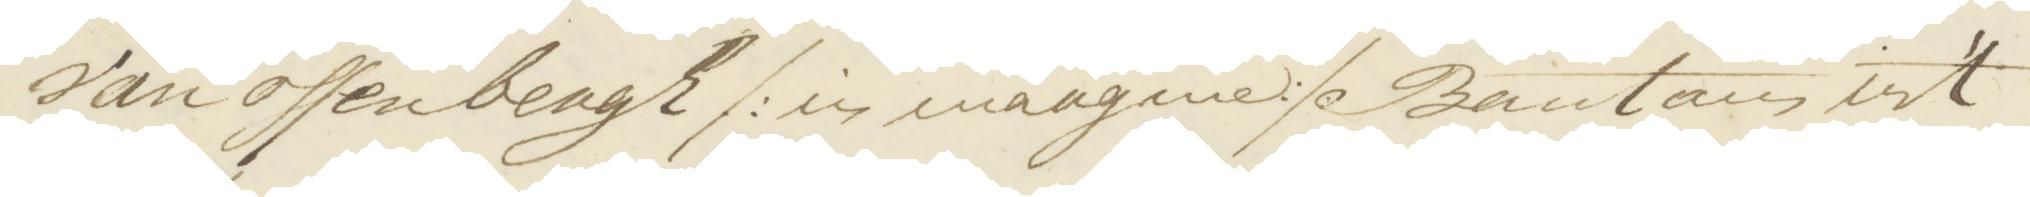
van offenbergh /:in margine:/ Bantam in't
